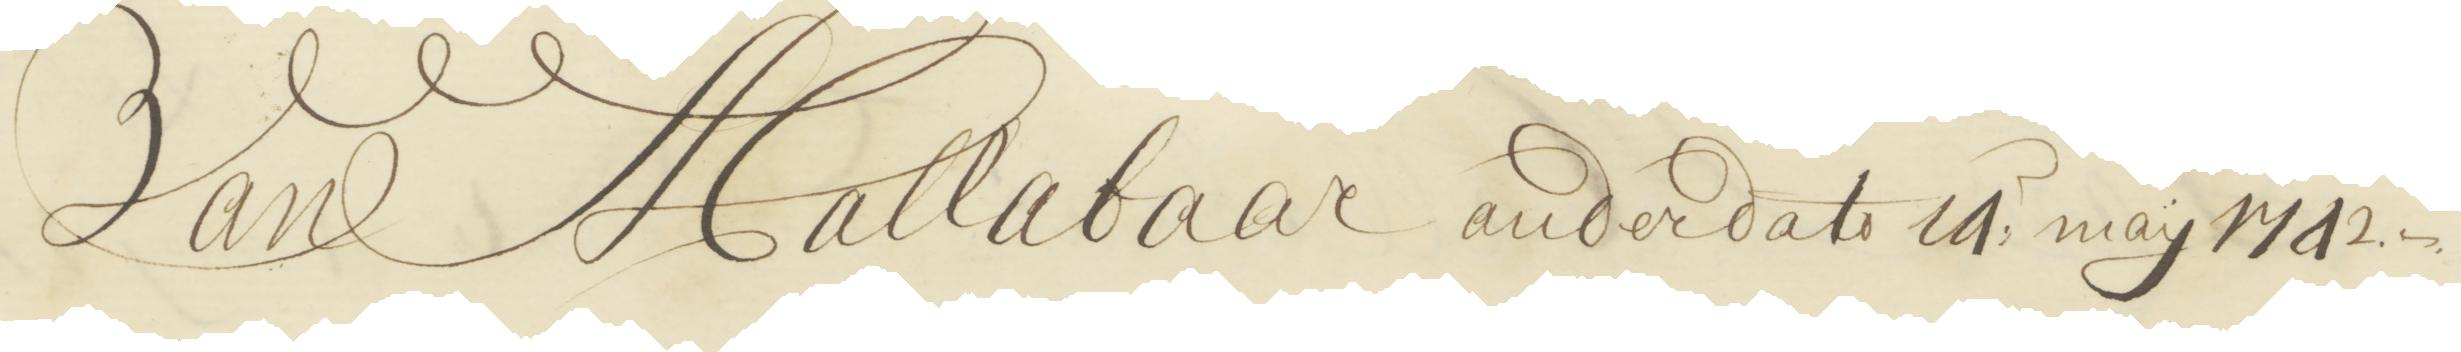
Van Mallabaar onder dato 14:' maij 1742.—
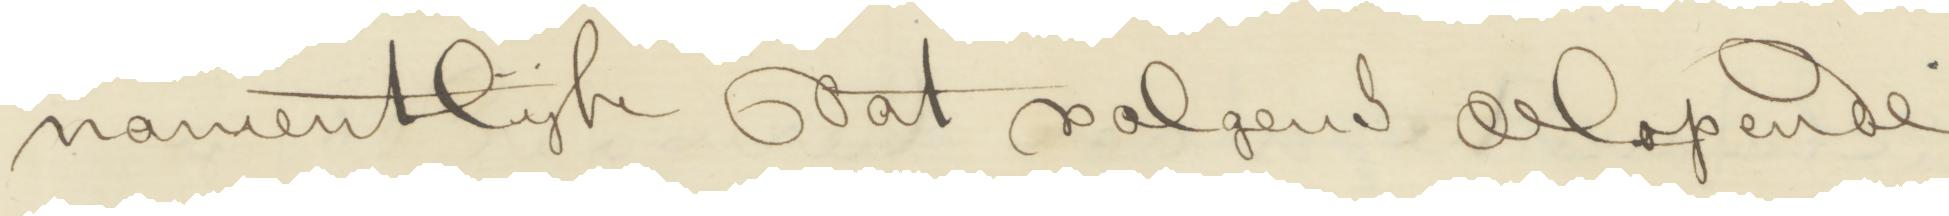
namentlijk dat volgens de lopende
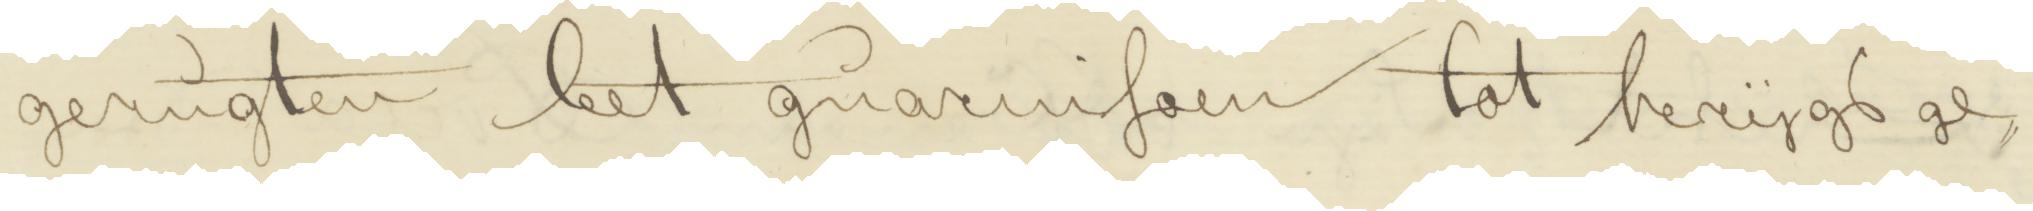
gerugten het guarnisoen tot krijgs ge„
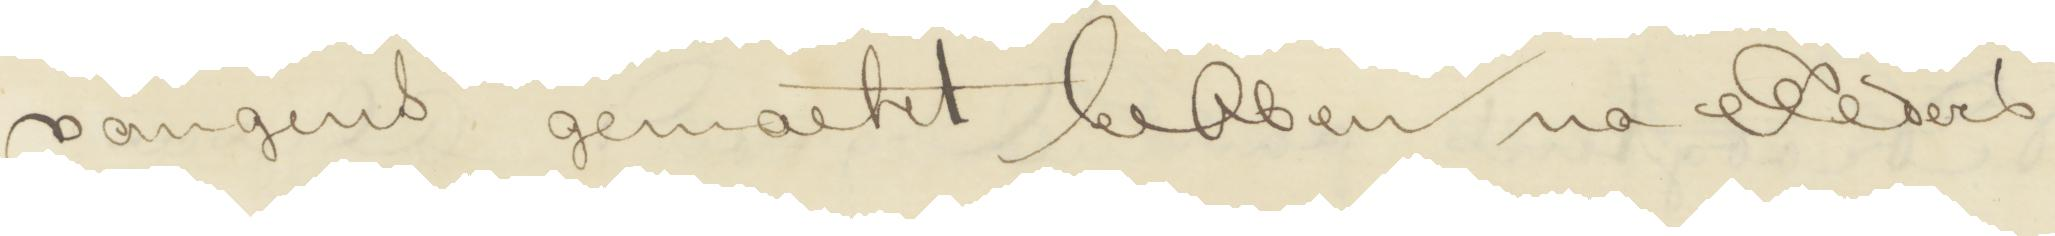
vangens gemaekt hebben na Elders
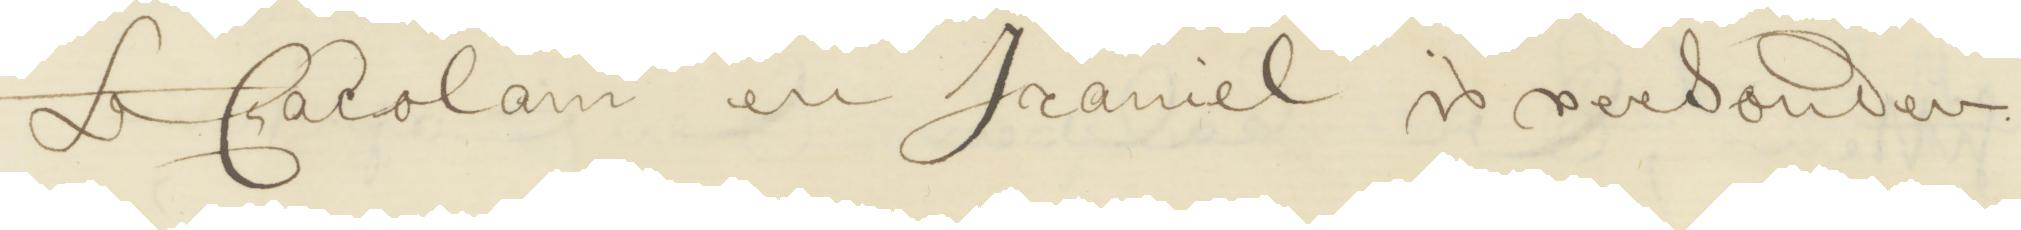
te Cacolam en Jraniel is versonden
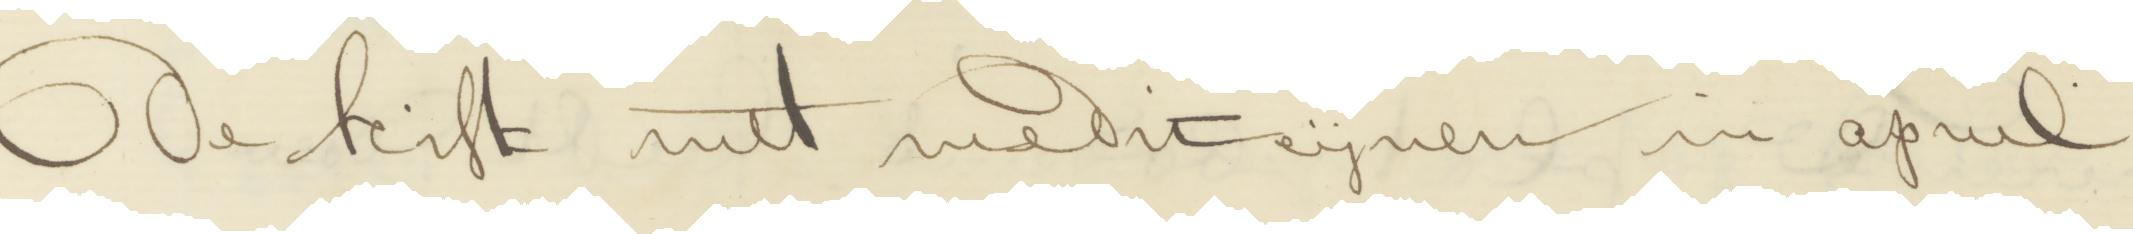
de kist met mediceijnen in april
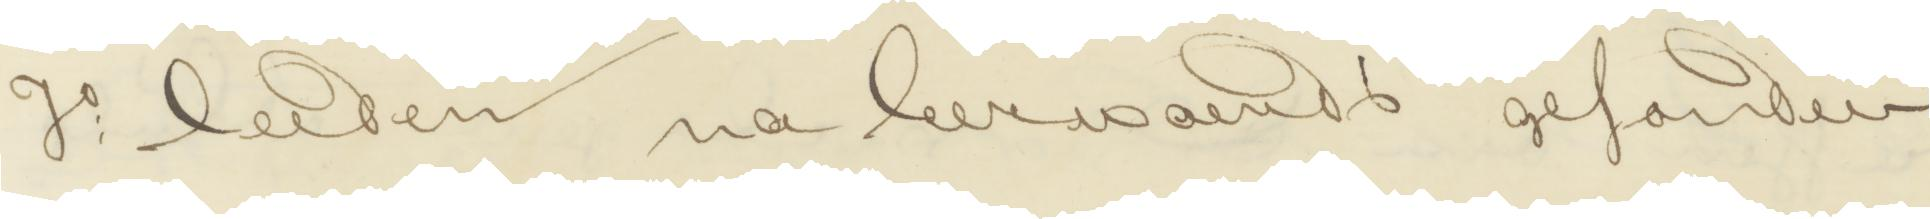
j:o leeden na herwaerds gesonden
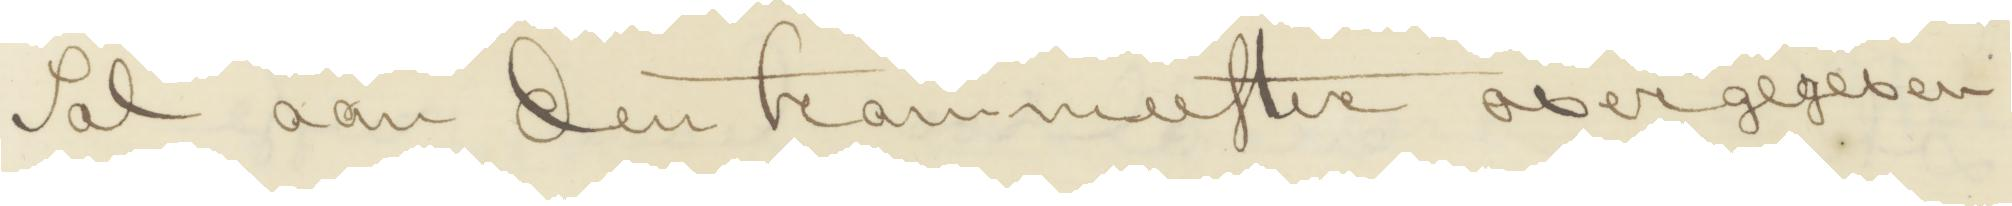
sal aan den trainmeester over gegeven
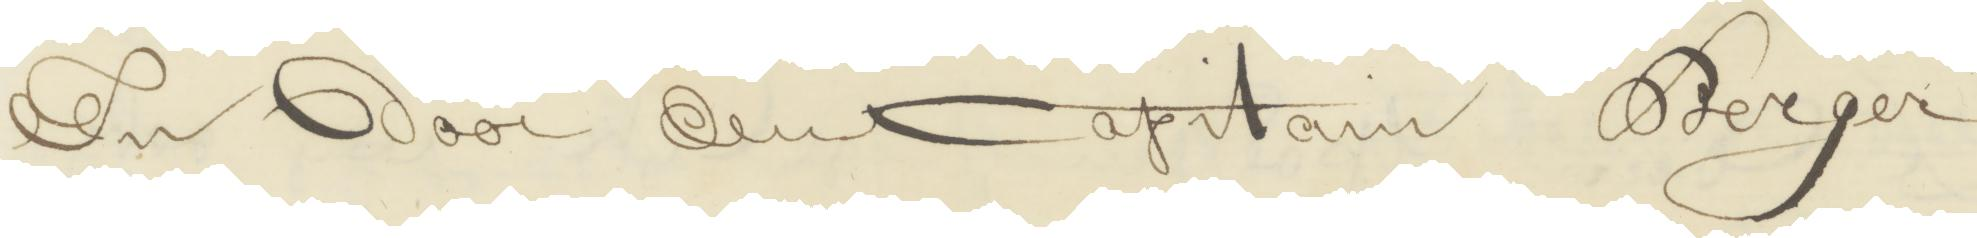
En door den Capitain Berger
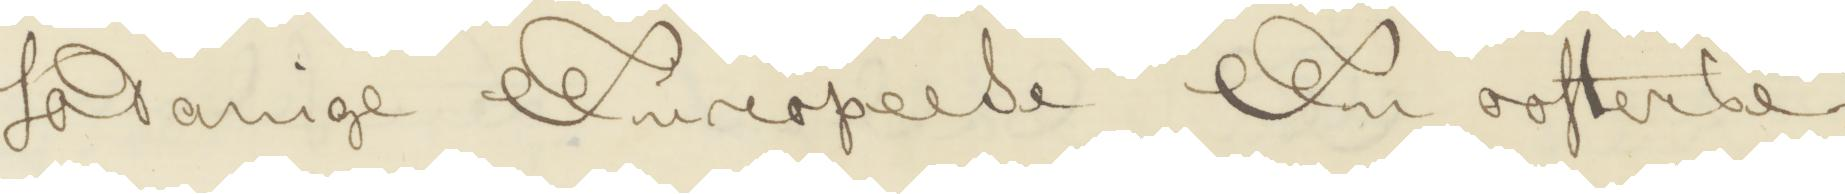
sodanige Europeese, En oosterse
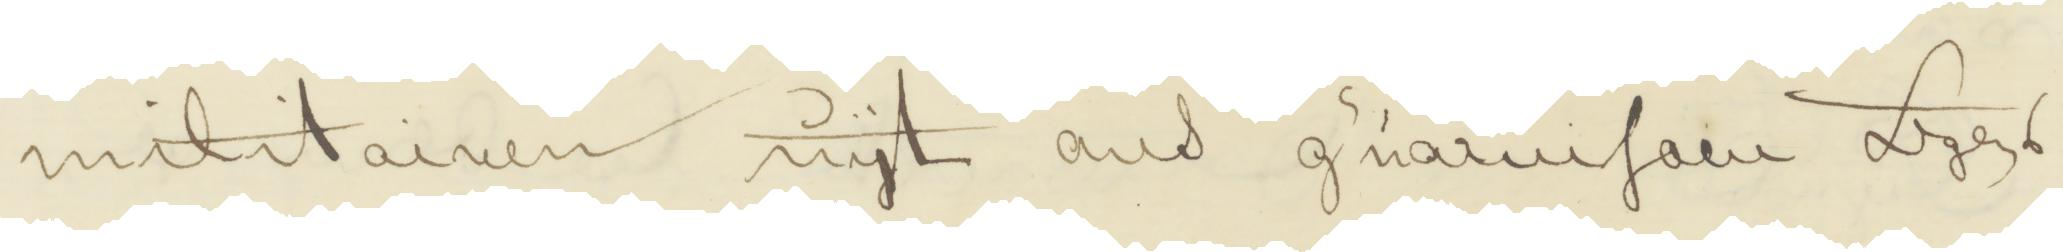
militairen uijt ons g’uarnisoen tegens
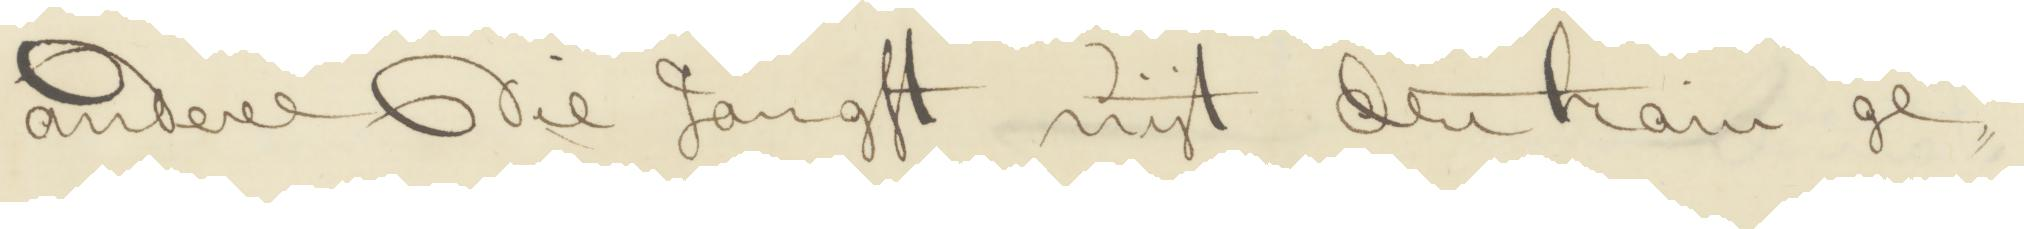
andere die jongst uijt den train ge„
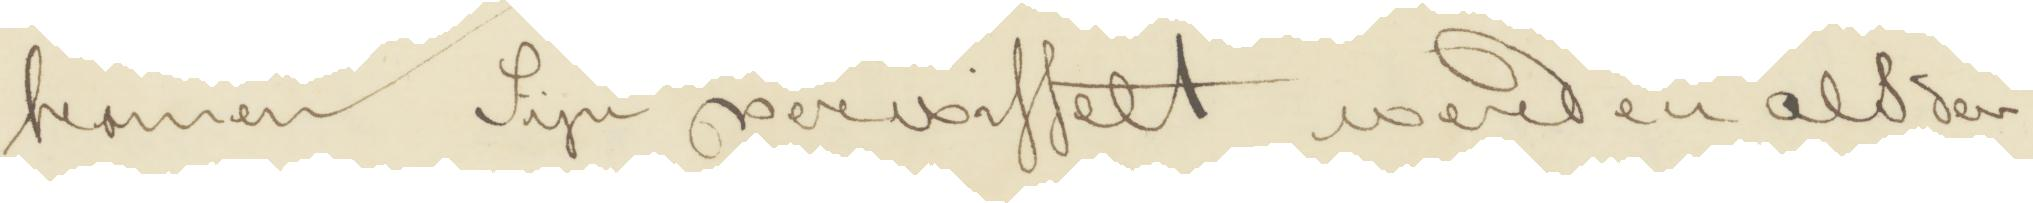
komen sijn verwisselt werden als den
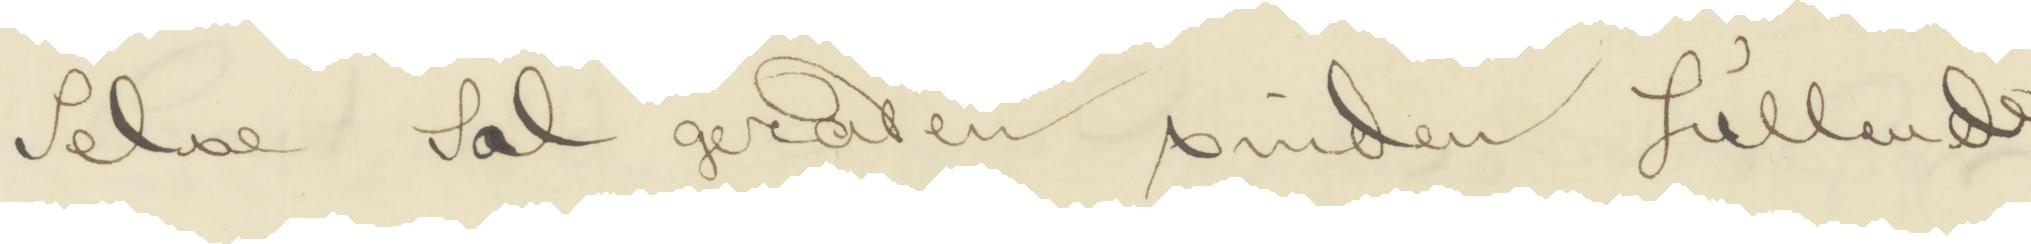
selve sal geraden vinden sullende
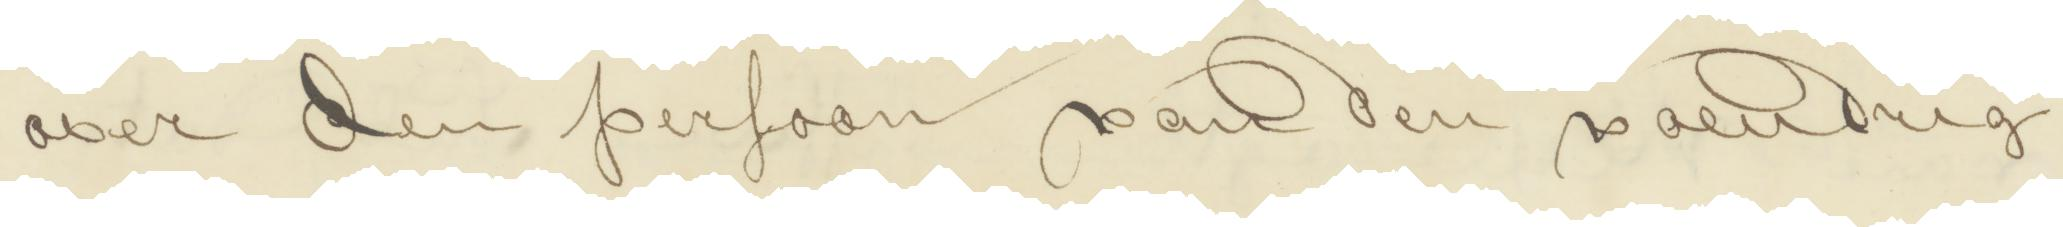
over den persoon van den vaendrig
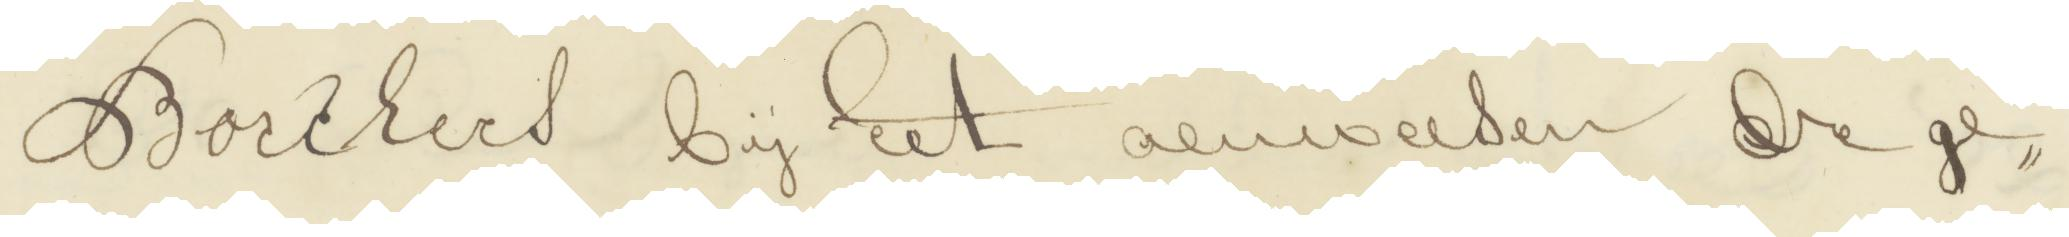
Borchers bij het aenweesen der ge„
